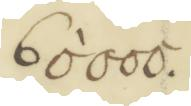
60'000.
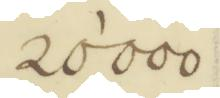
20'000
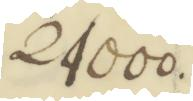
24000.
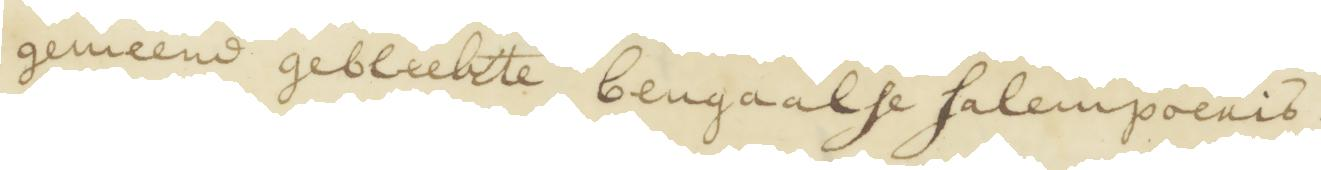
gemeene gebleekte bengaalse salempoeris
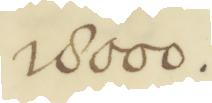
18000.
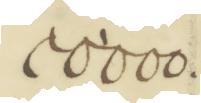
50'000.
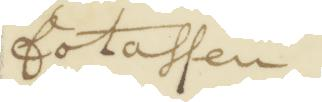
fotassen
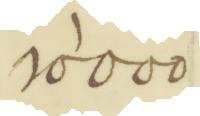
10'000
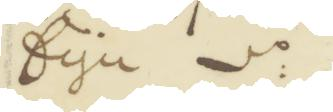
fijn d:o
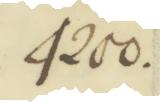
4200.
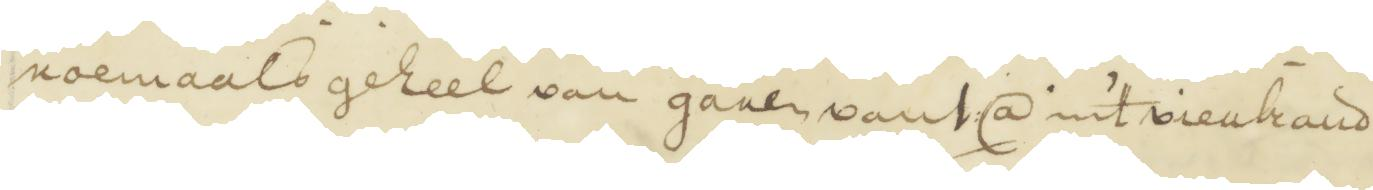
roemaals geheel van garen vant @ in't vierkand
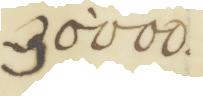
30'000.
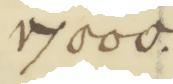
17000.
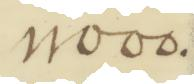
11000.
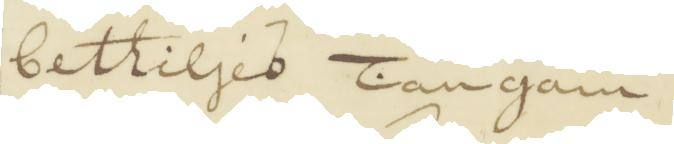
bethiljes Cangam
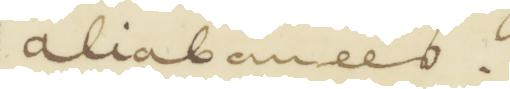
aliabanees
